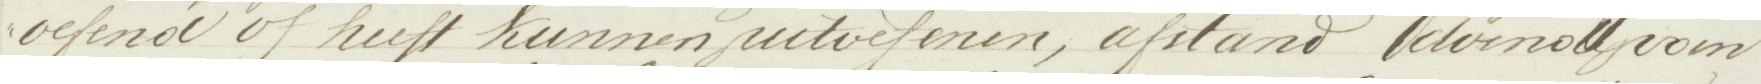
oefend of heeft kunnen, uitoefenen, afstand doen van
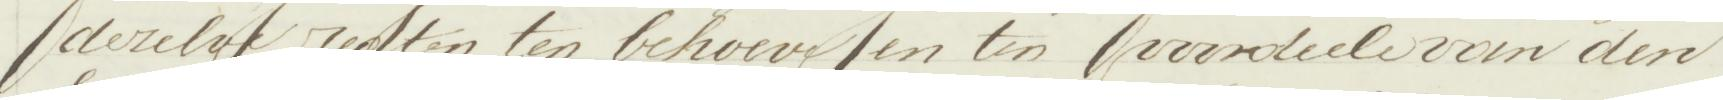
dezelve regten ten behoeve en ten voordeele van den
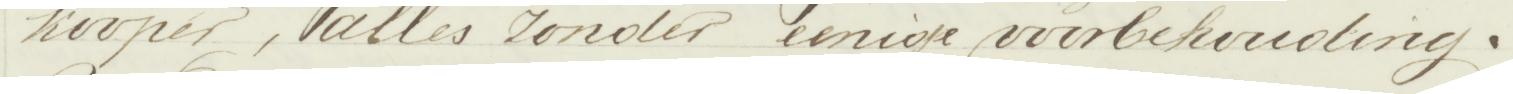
kooper, alles zonder eenige voorbehouding.
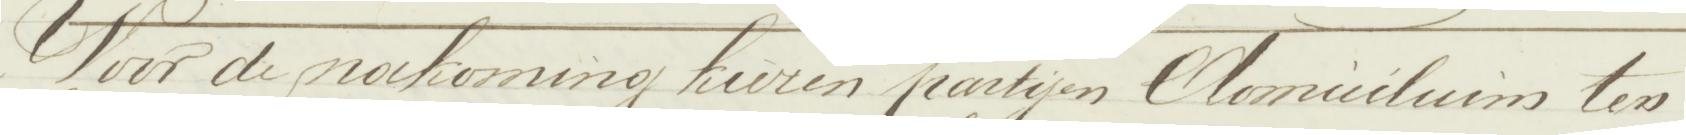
Voor de nakoming keeren partijen domicituim ten
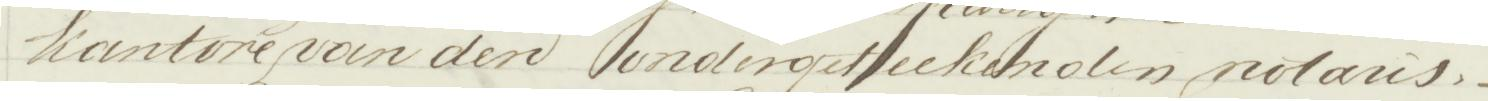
kantore van den ondergeteekenden notaris.
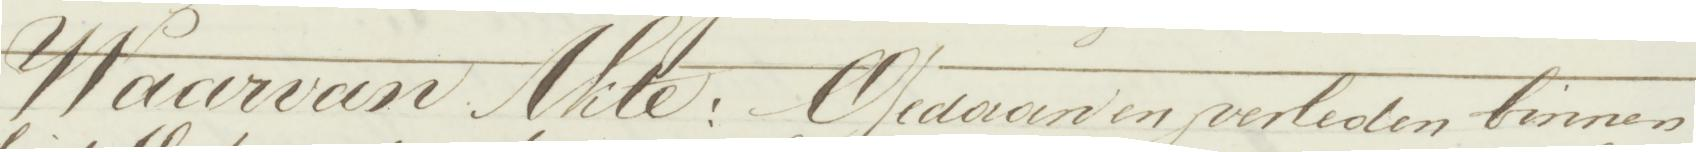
Waarvan Akte: Gedaan en verleden binnen
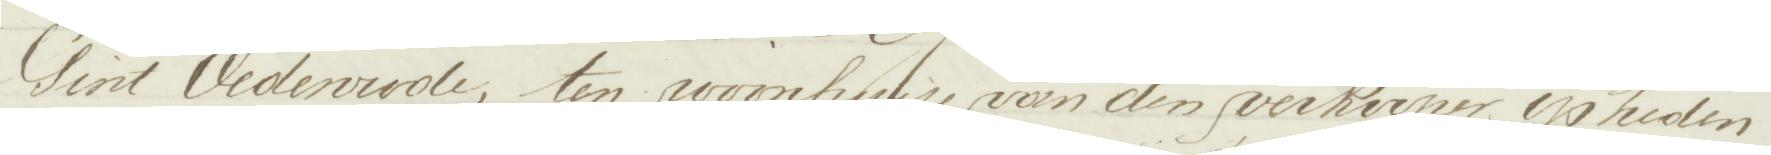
sint Oedenrode, ten woonhuize van den verkooper, op heden
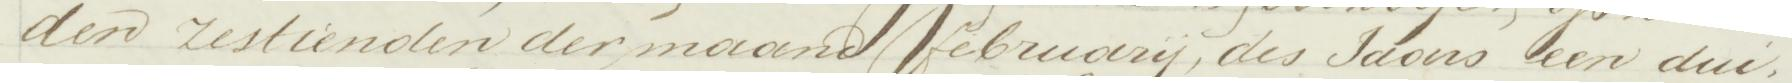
den zestienden der maand februarij, des Jaars een dui„
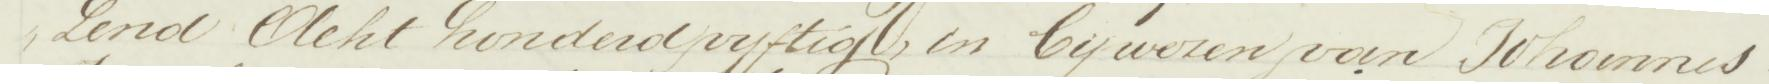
„zend Acht honderd vyftig, in bij wezen van Johannes
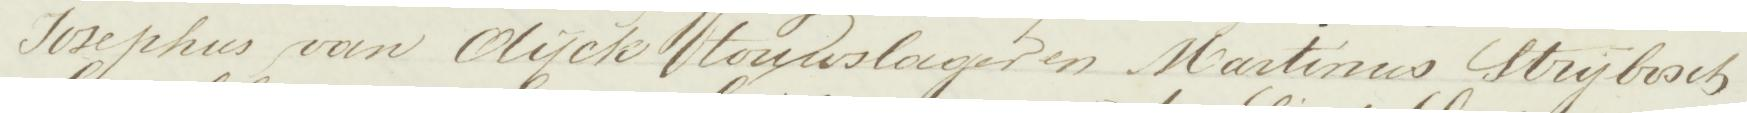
Josephus van dijck touwslager en Martinus Strijbosch
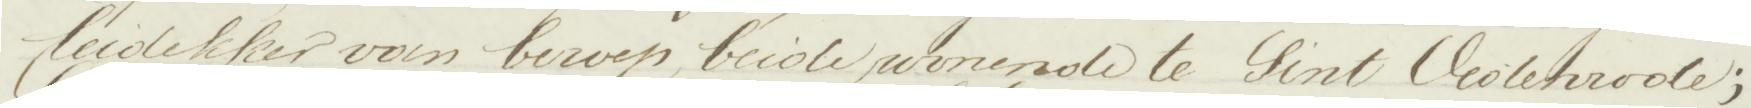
leidekker van beroep, beide wonende te Sint Oedenrode;
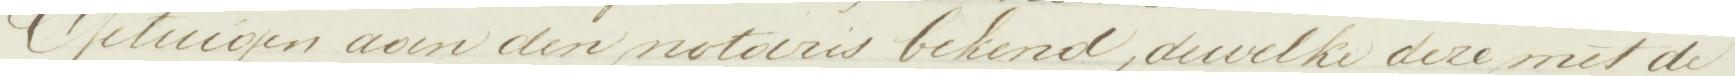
Getuigen aan den notaris bekend, dewelke deze met de
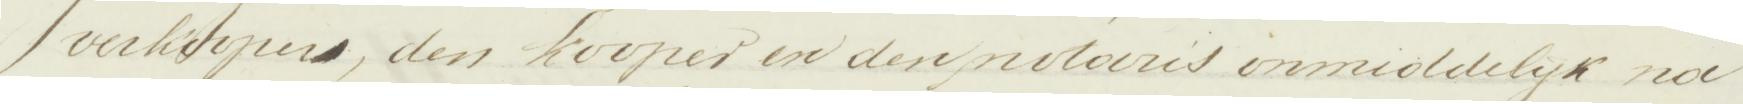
verkoopers, den kooper en den notaris onmiddelijk na
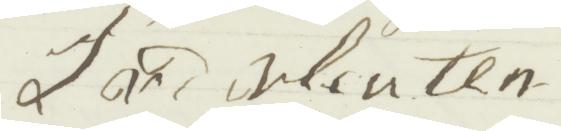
Lvd vleuten
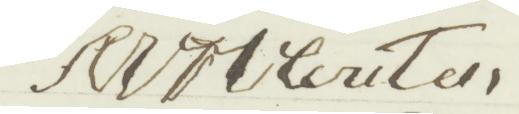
Rvd vleuten
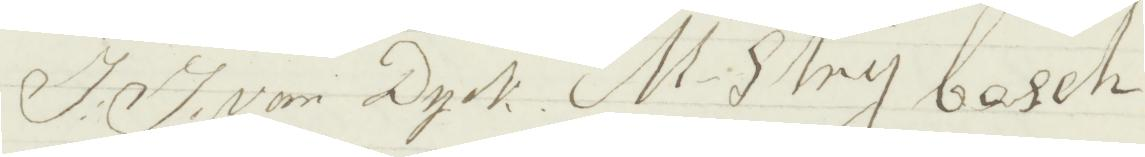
J: J: van Dyck. M-Stry bosch
